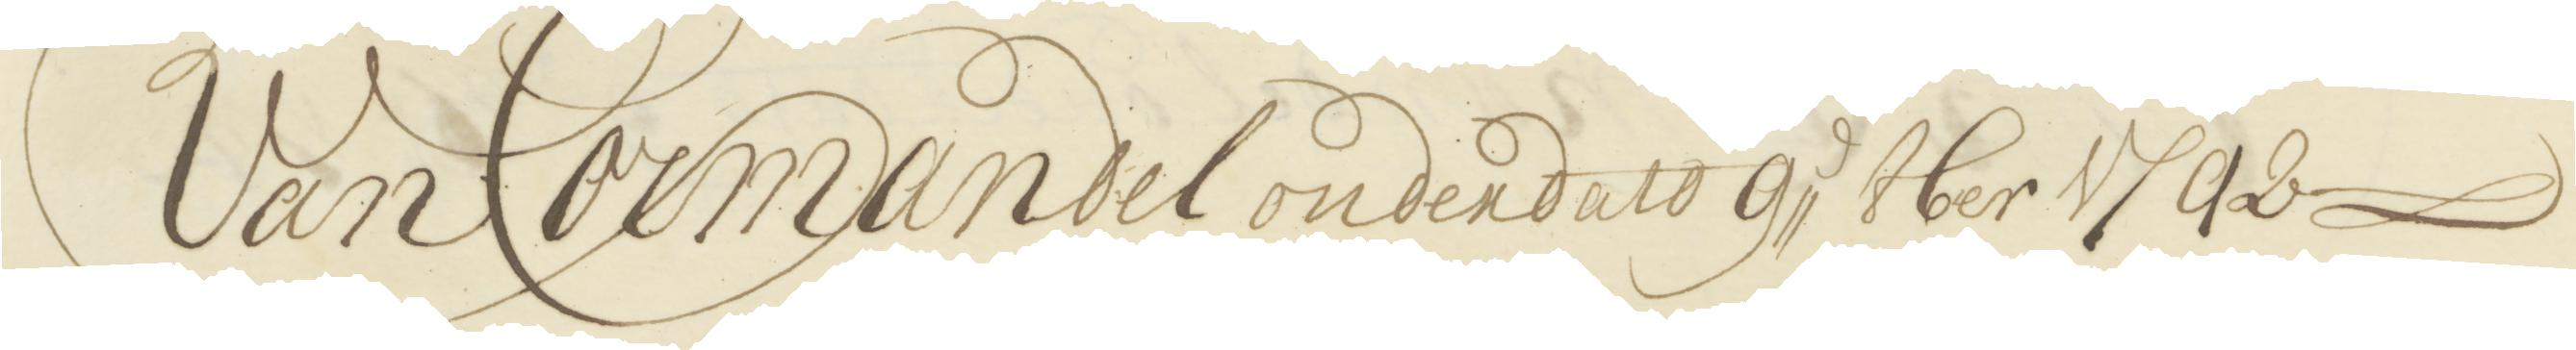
Van Cormandel onder dato 9„e 8ber 1742
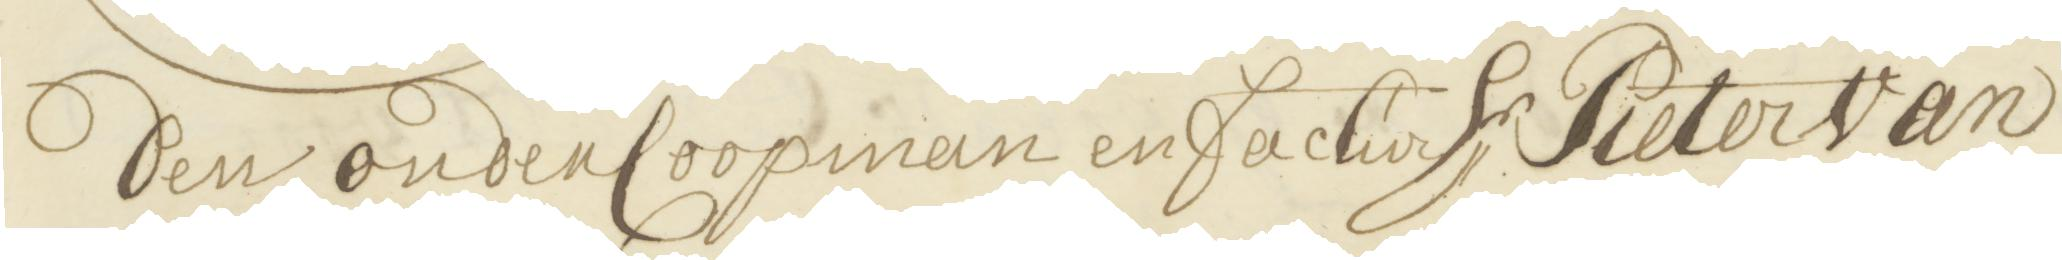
den onderCoopman en factur h„r Pieter van
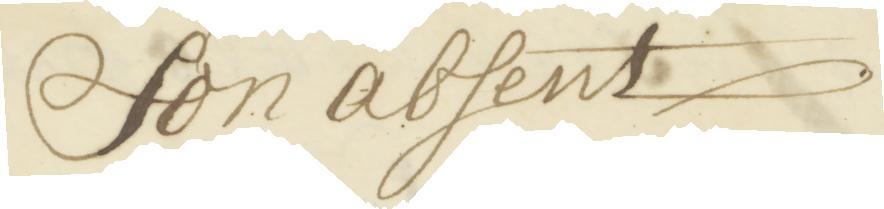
Son absent.
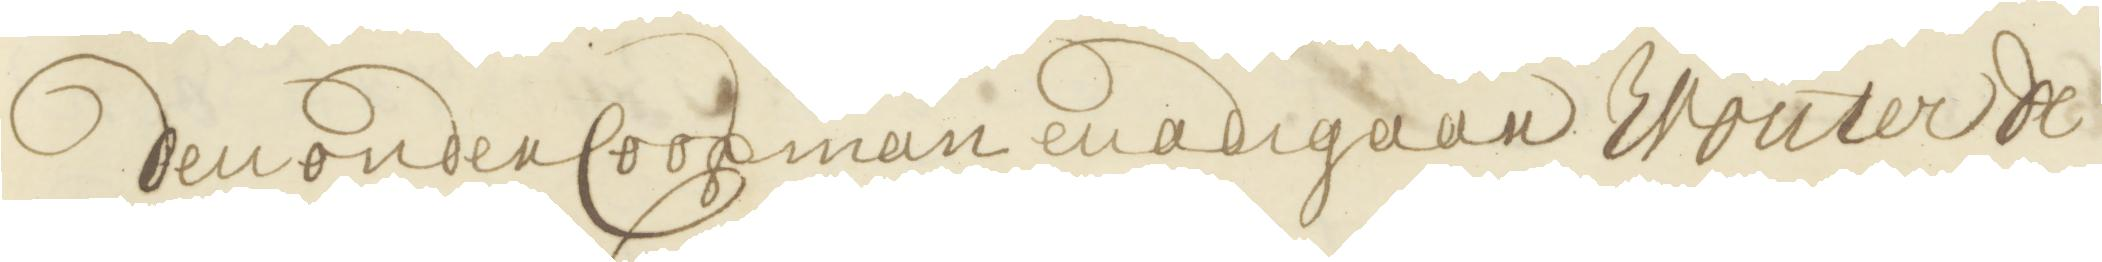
den onderCoopman en adigaar Wouter de
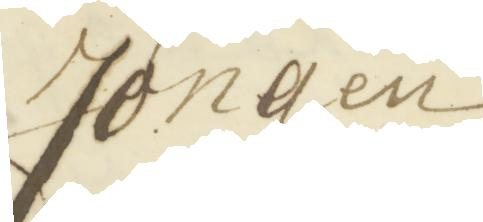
Jongen
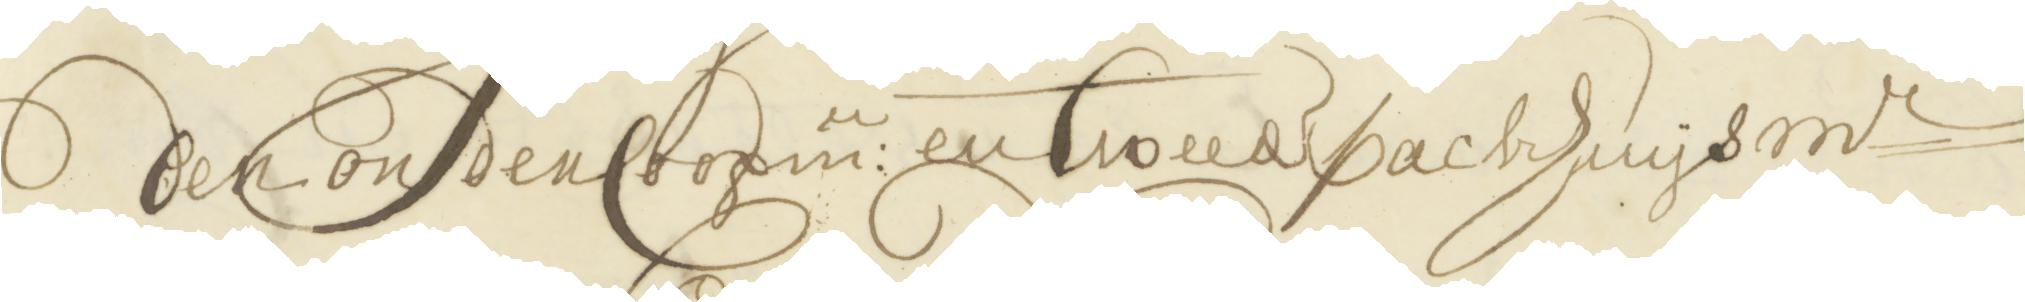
den onderCoopm:n en twee de packhuijs m=r
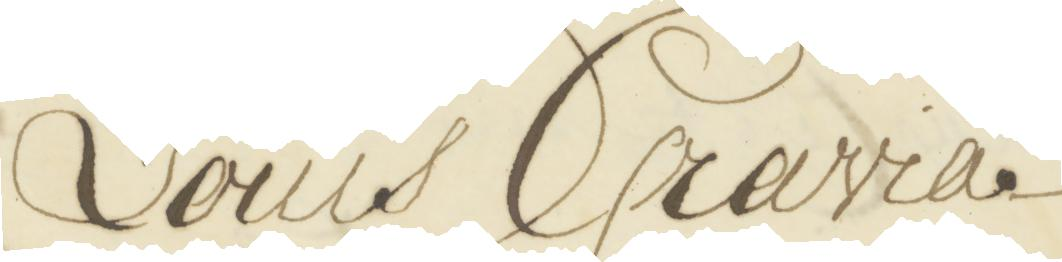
Louis Gravia
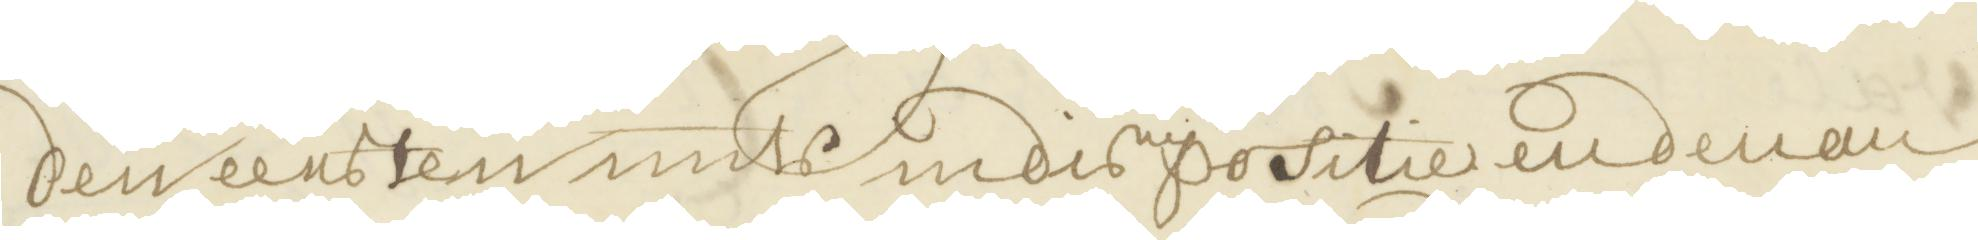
den eersten mits indispositie en den an
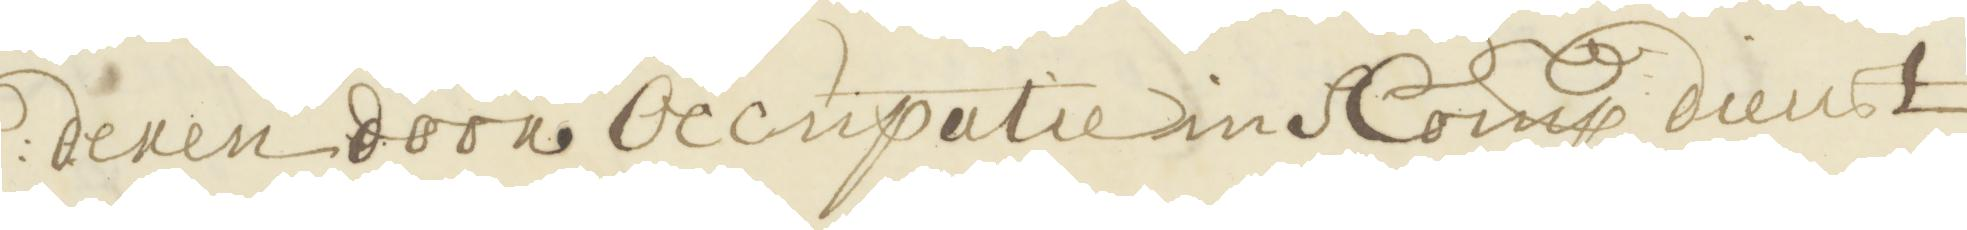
:deren door Occupatie in sComp: dienst
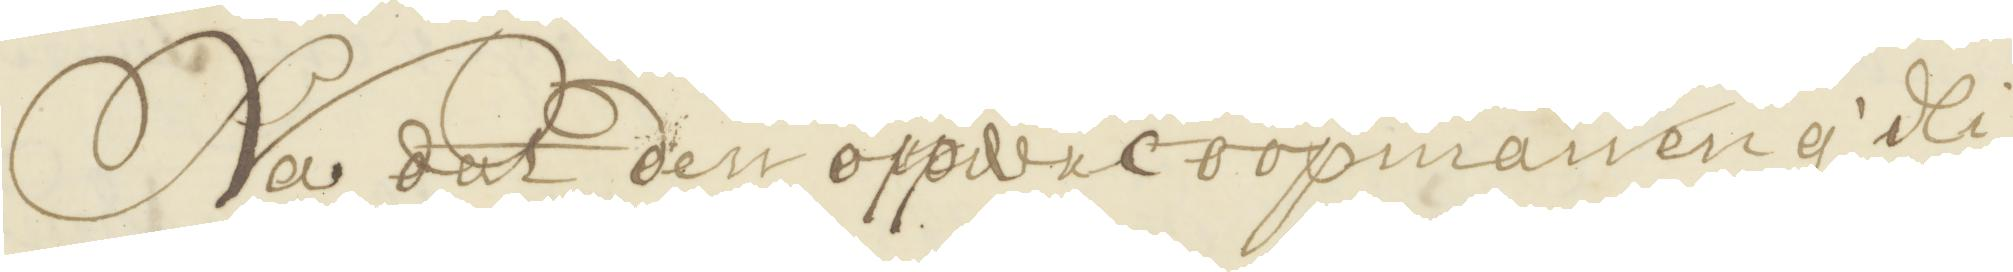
Na dat den oppdercoopman en g’eli
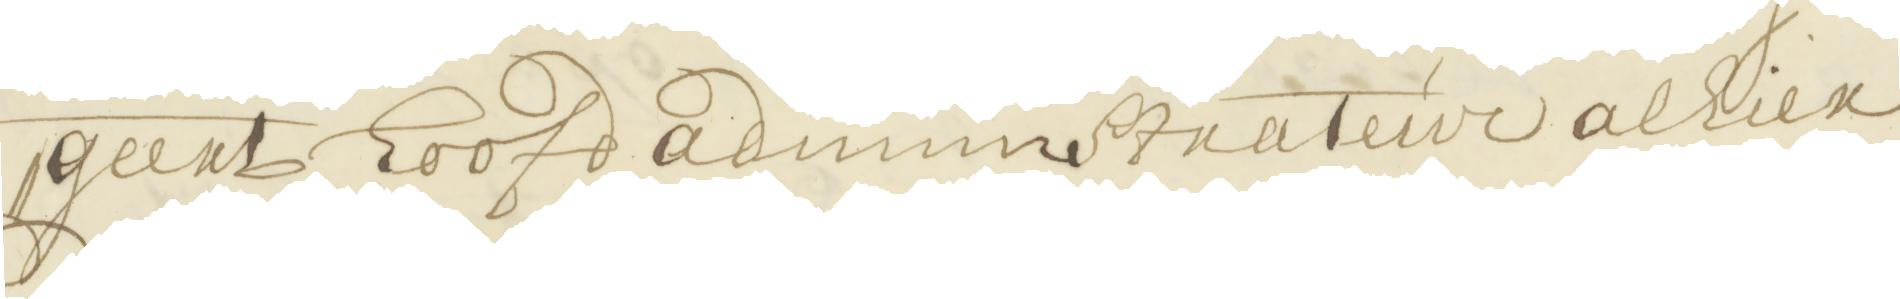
„geert hoofd administrateur alhier
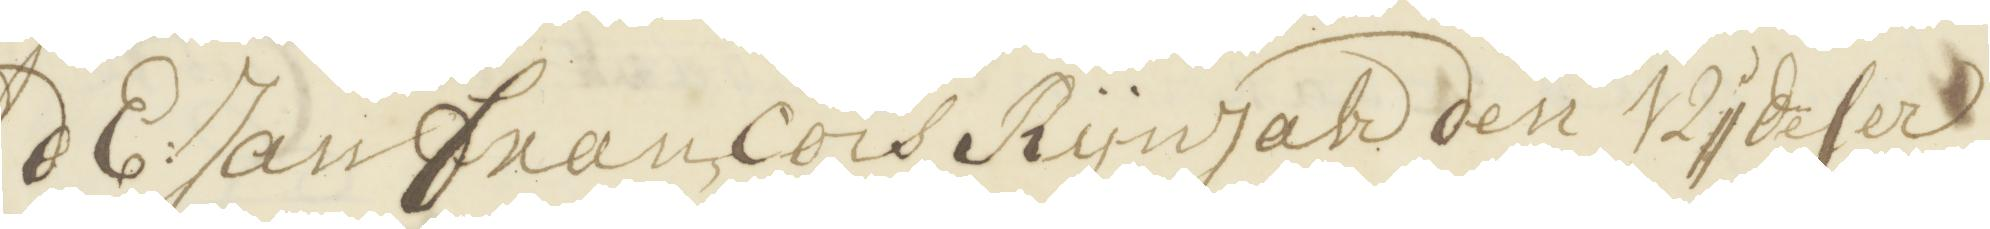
d E: Jan francois Rijnjak den 12„' deser
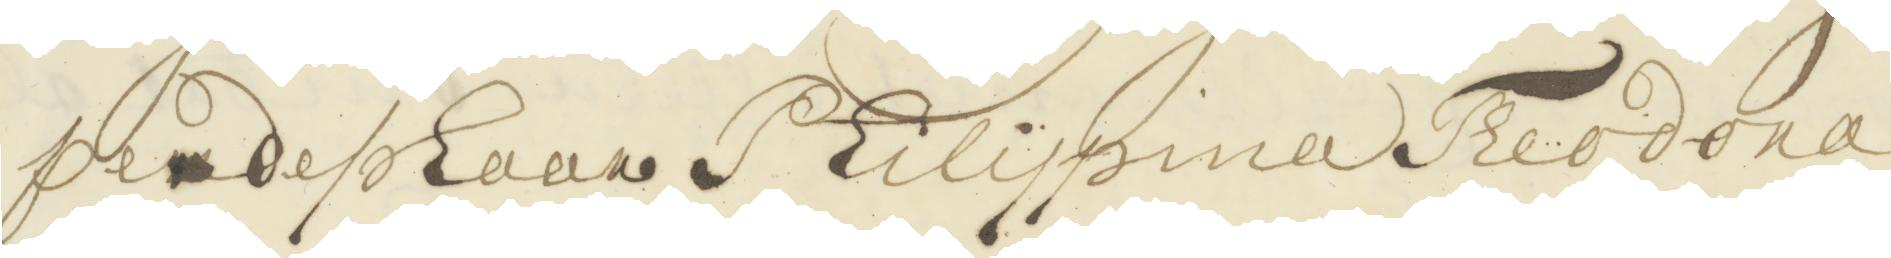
per dephaar Philijpina Theodora
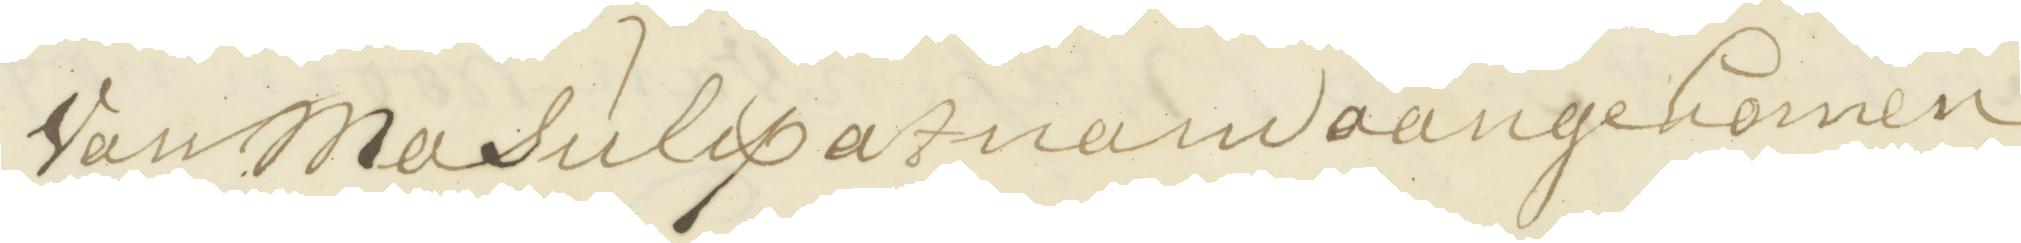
van Masulipatnam aangekomen
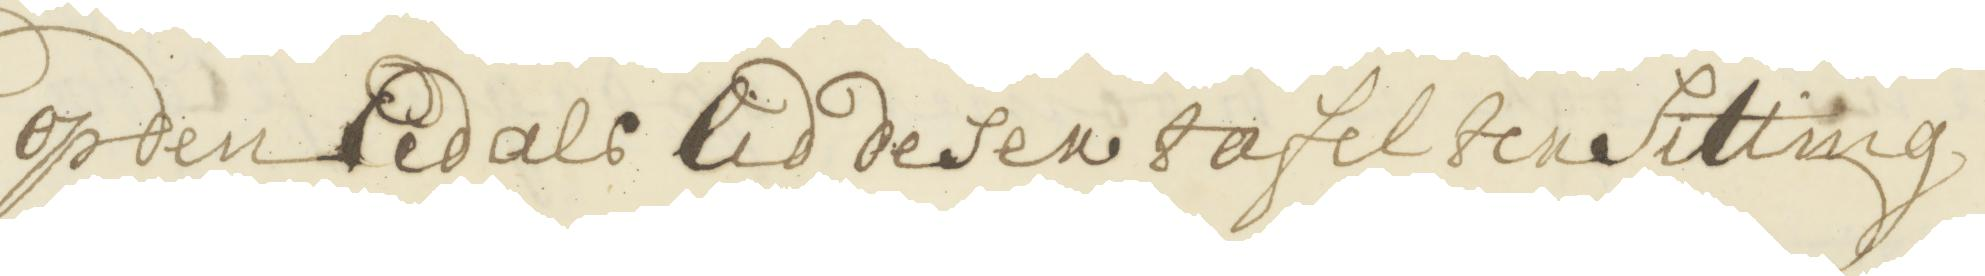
op den tedals lid deser tafel ter sitting
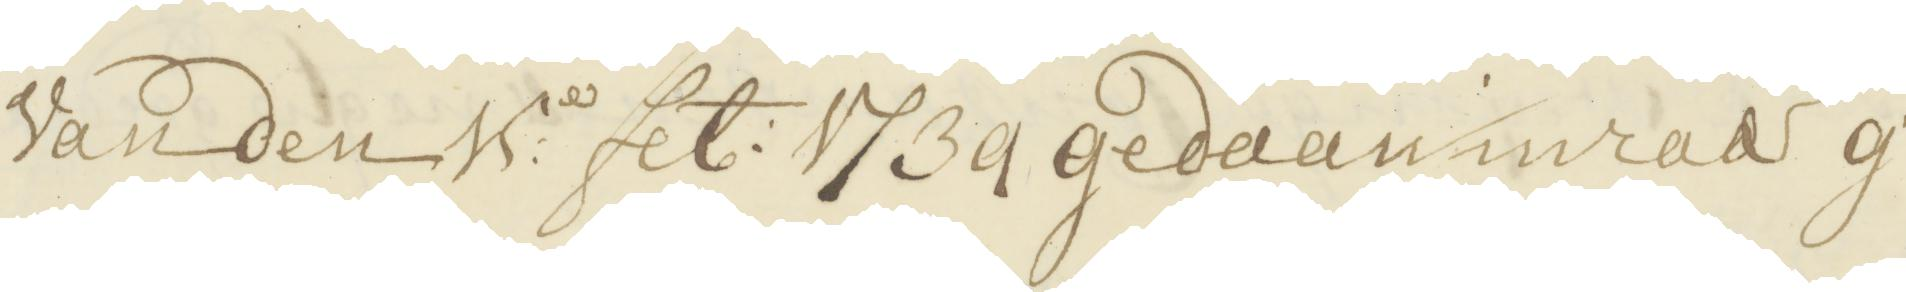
van den 15:e feb: 1734 gedaan in rade g
